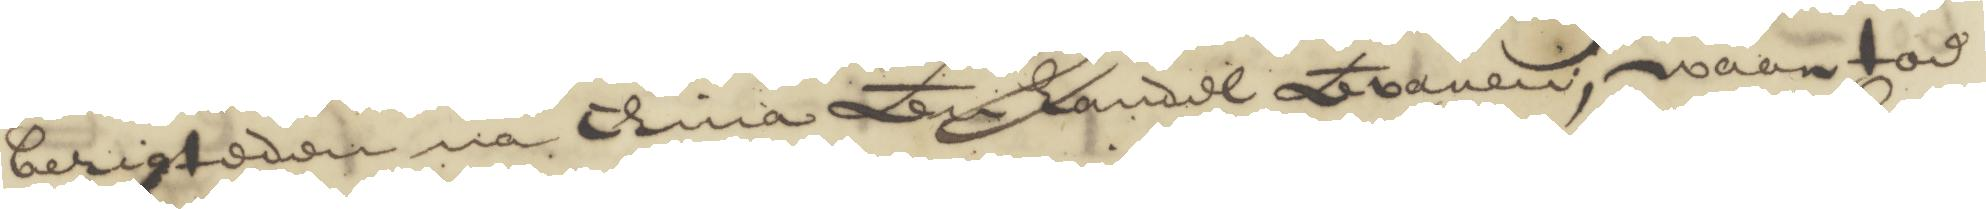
berigte den na China ten handel te varen, waar toe
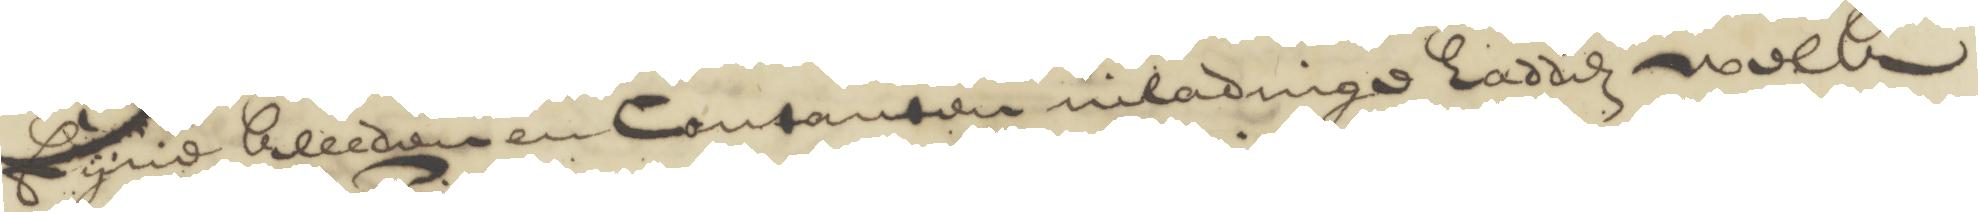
fijne kleeden en Contanten inladinge hadden welk
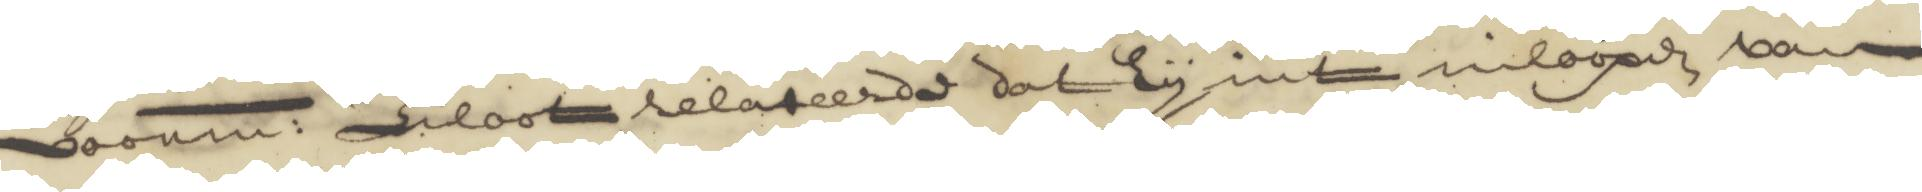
voorm: Piloot relateerde dat hij in 't in loopen van
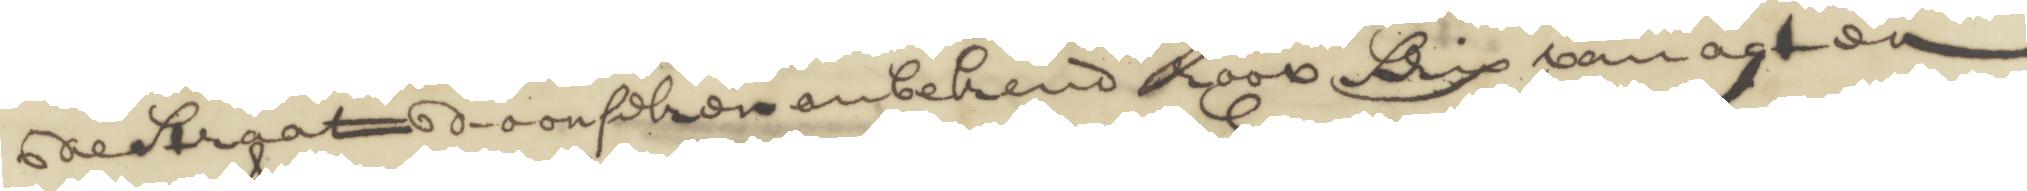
de Straat door selven onbekend roov schip van agter
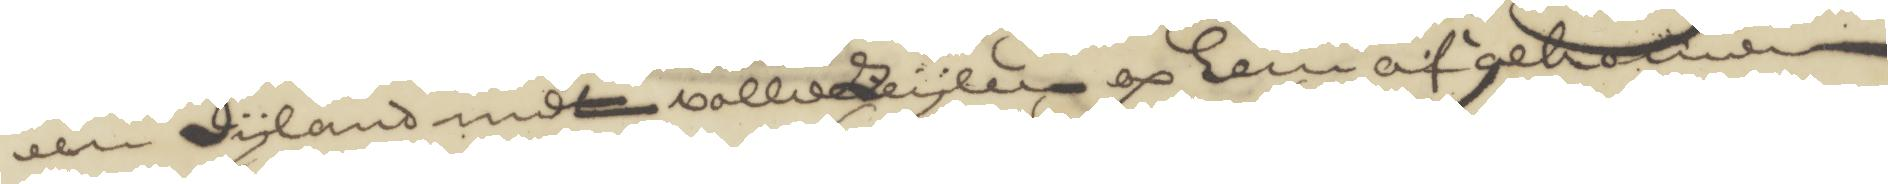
een Eijland met volle Zeijlen op hem afgekomen
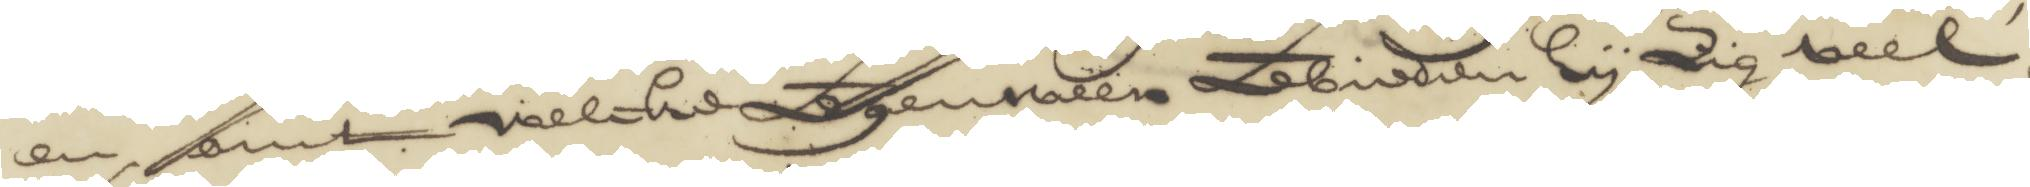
en om 't welcke tegen weer te bieden hij Zig veel
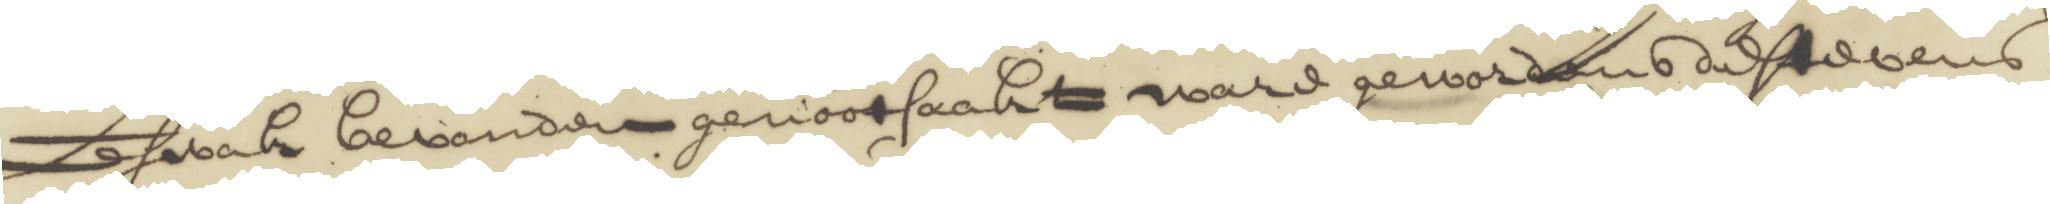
teswak bevonden genootsaakt ware gewordens de stevens
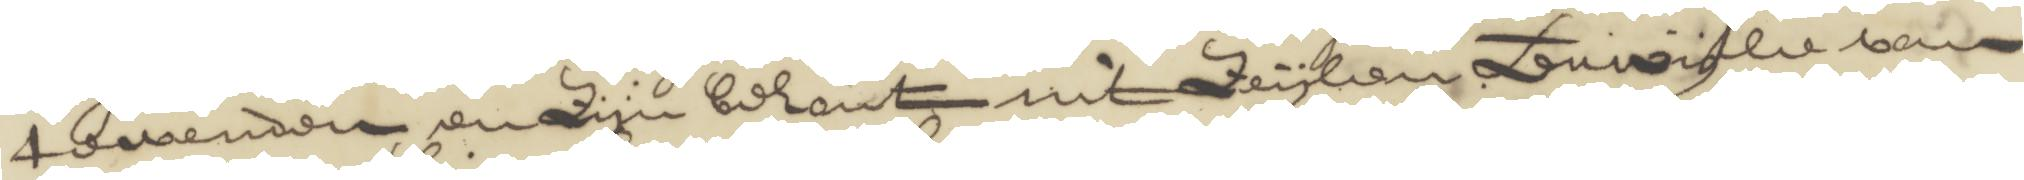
tewenden en Zijn behout in’t Zeijlen ter wijle van
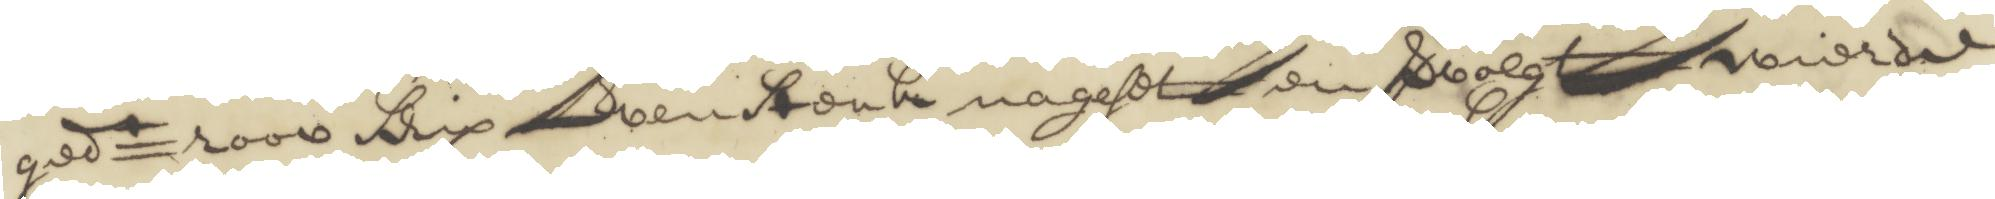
ged=t roov Schip Evensterk nageset en vervolgt wierde
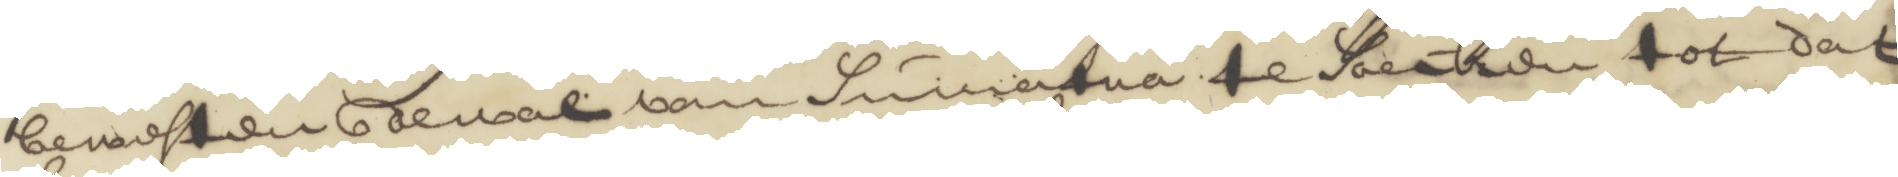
bewesten dewal van Sumatra te Soecken tot dat
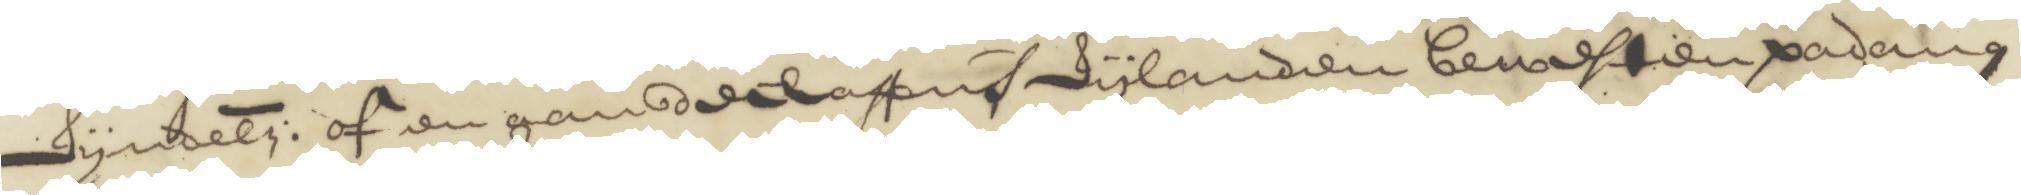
Eijndelijk of en aan de clappus Eijlanden bewesten padang
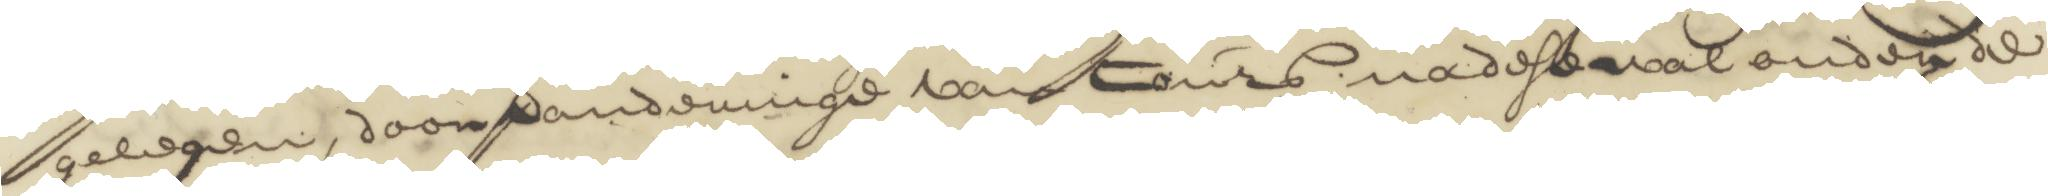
gelegen, door veranderinge van cours na dese wal onder de
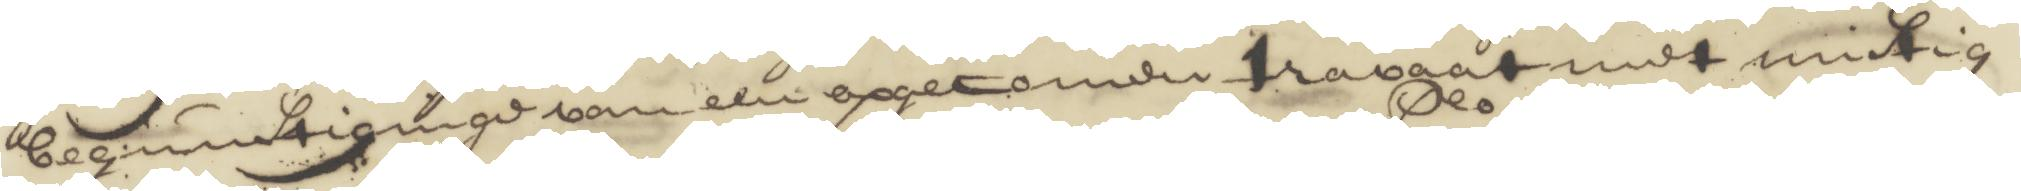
beguntiginge van een opgecomen travaat met mistig
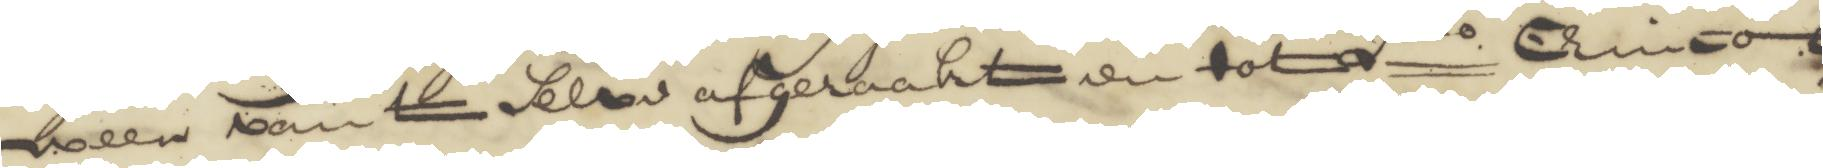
weer van 't Selve afgeraakt en tot P=lo Chinco
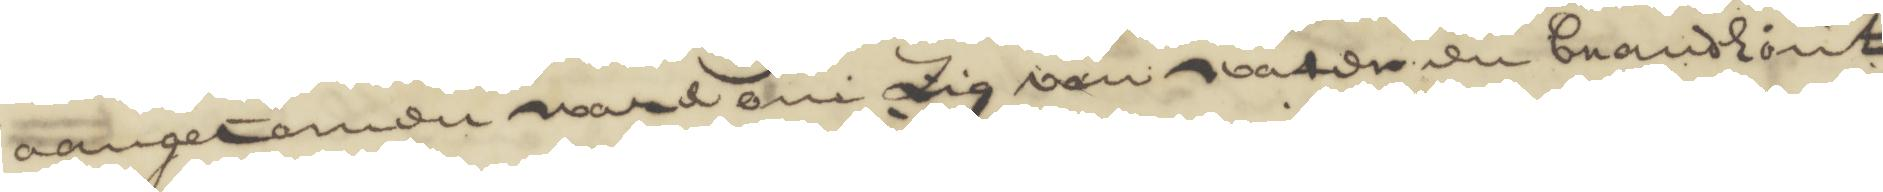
aangecomen ware om Zig van water en brandhout
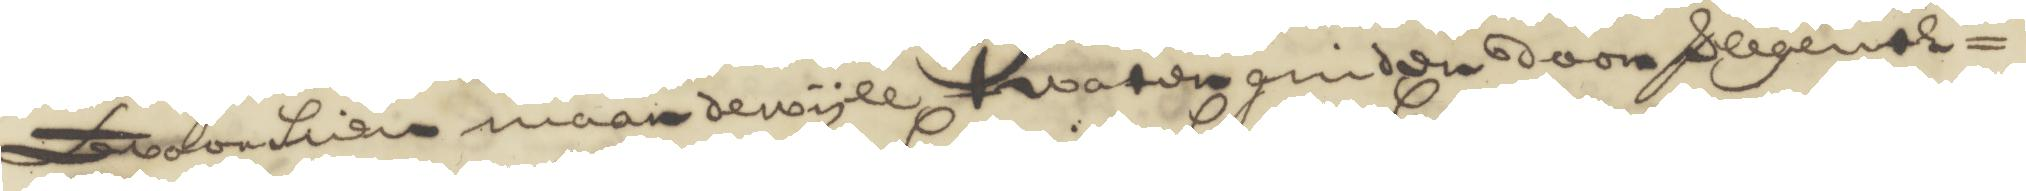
te voorsien maar de wijle 't water ginder door verlegenth=t
